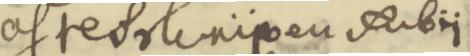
afteschrijven Enbij
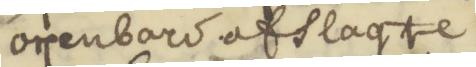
openbare afslag te
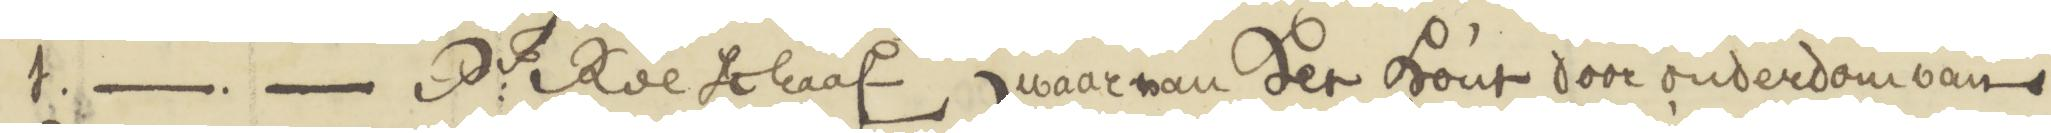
1. —. — P:s Relschaaf } waar van der Hout door ouderdom van
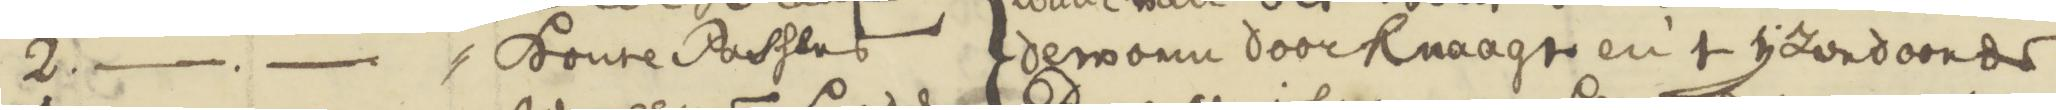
2. —. — „ Houte Passers } deworm door knaagt en ’t ijzer doorde
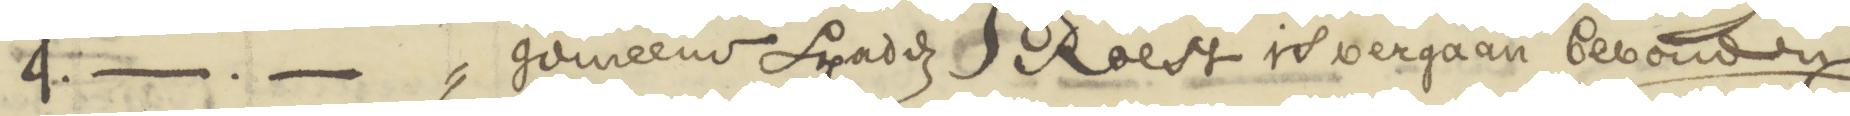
4. —. — gemeene spaden } Roest is vergaan bevonden
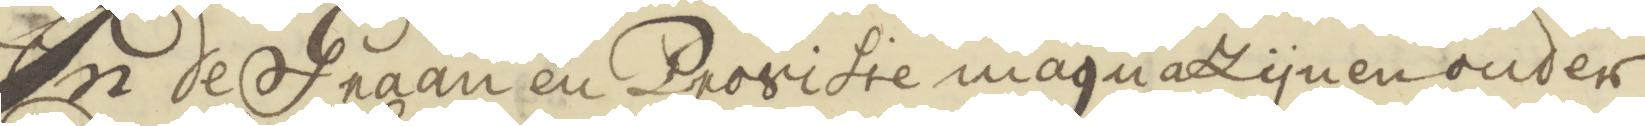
In de Graan en Provisie maguazijnen onder
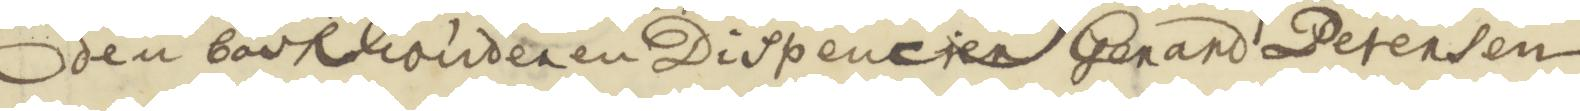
den boekhouder en Dispencier Gerard Petersen
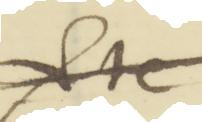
Etc
